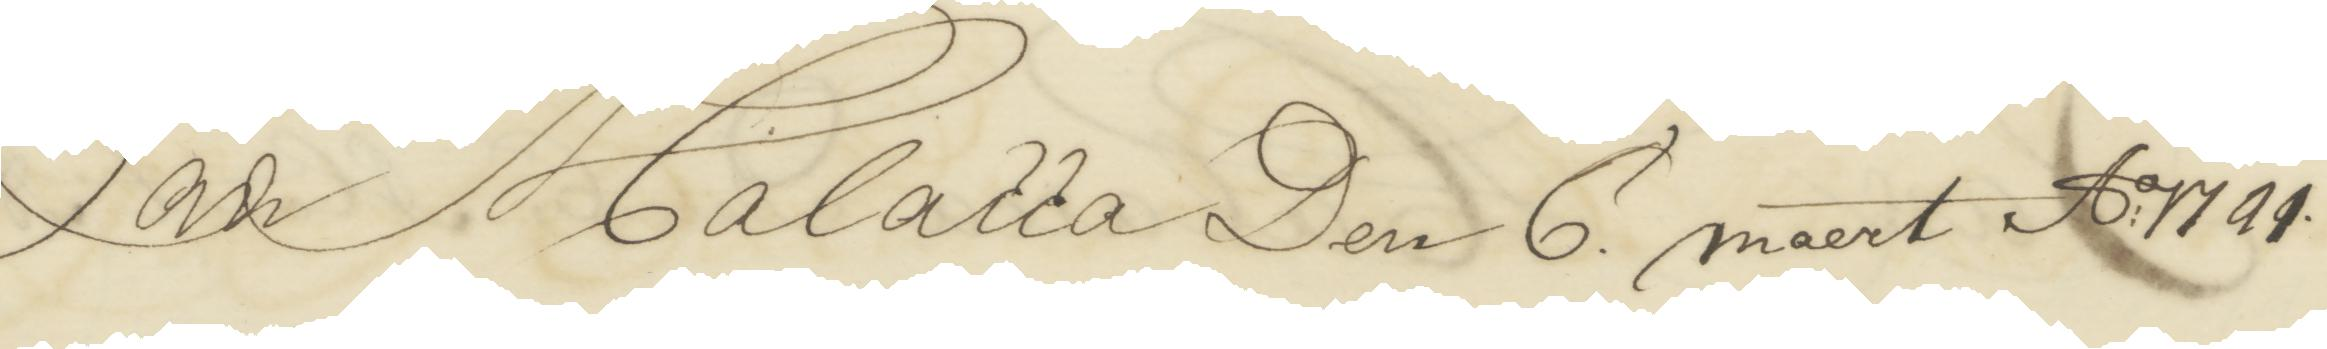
Van Malacca Den 6. maert Ao 1744.
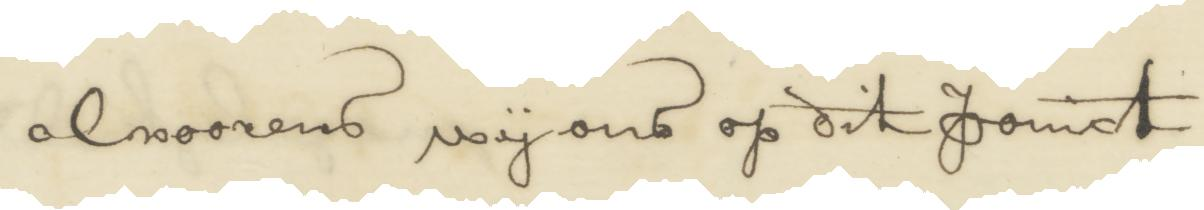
alvoorens wij ons op dit poinct
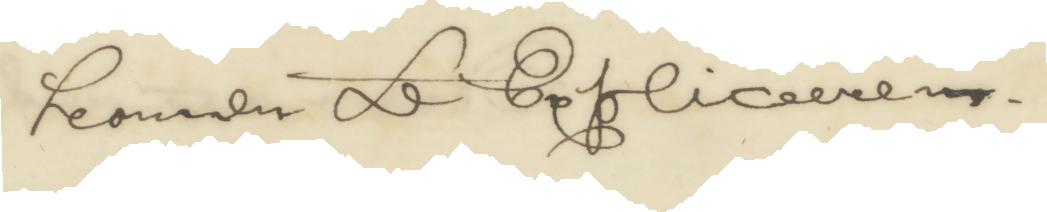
komen te Expliceeren
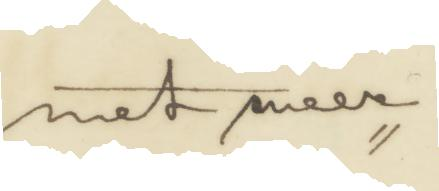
met meer„
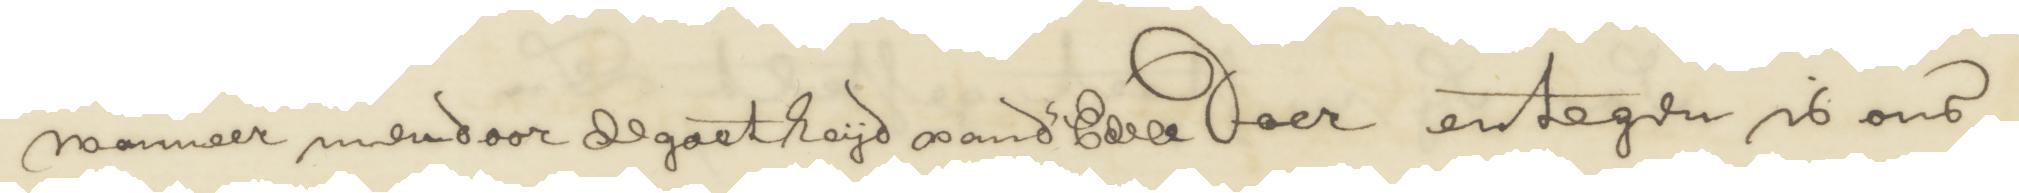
wanneer men door de goetheijd van d’ Edele daer entegen is ons
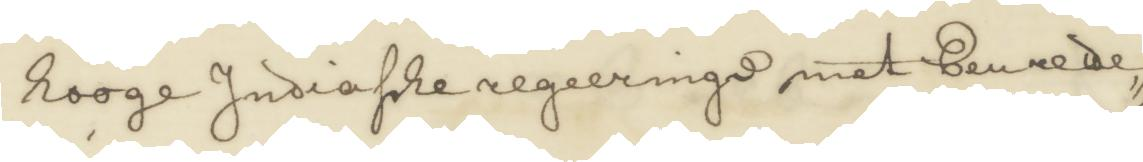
hooge Jndiasche regeeringe met Een rede„
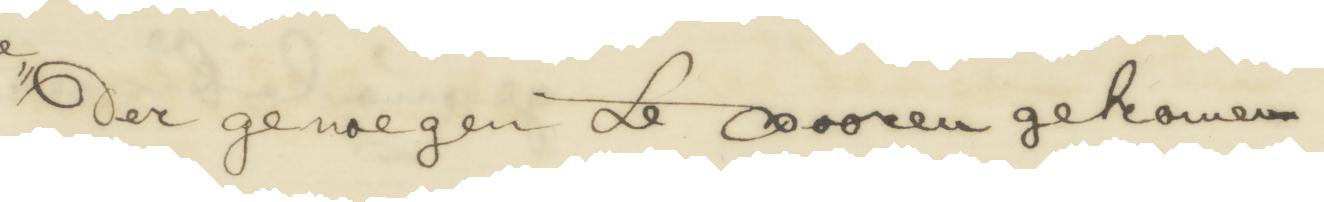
der genoegen te vooren gekomen
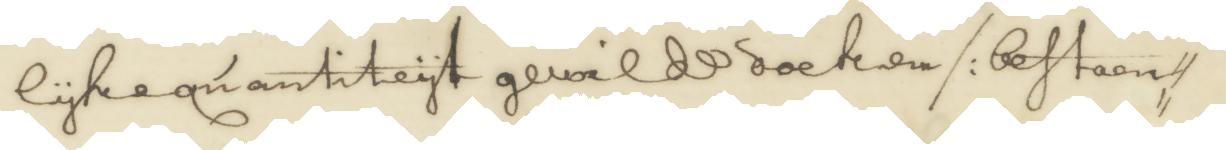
lijke quantiteijt gewilde doeken /:bestaen„
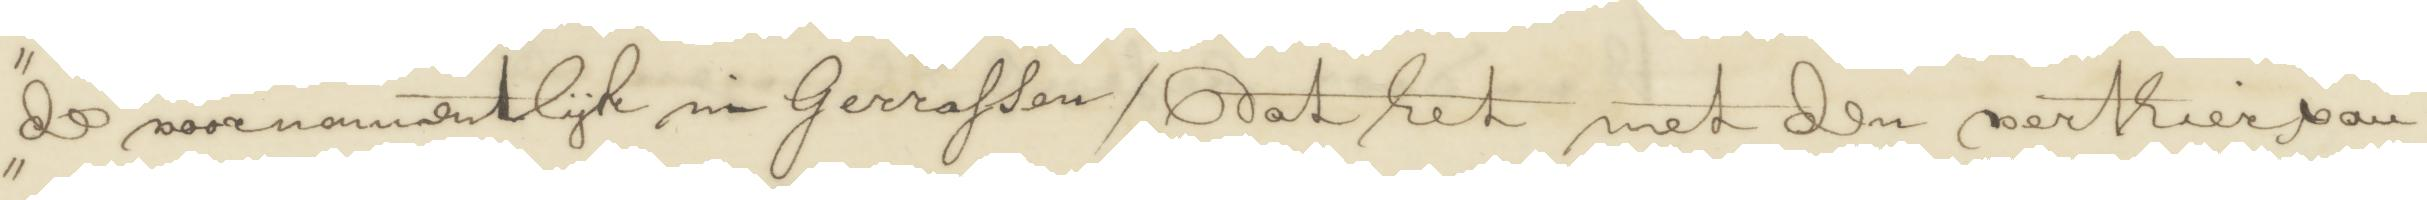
de voornamentlijk in Gerrassen / dat het met den verthier van
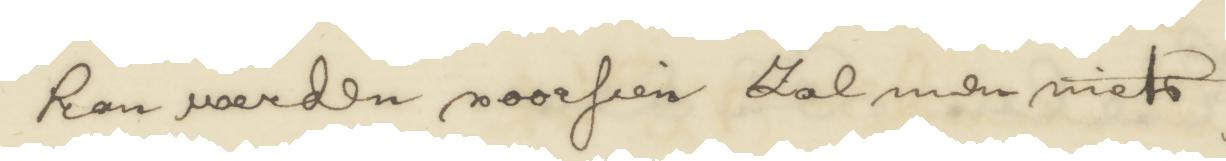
kan werden voorsien Zal men niets
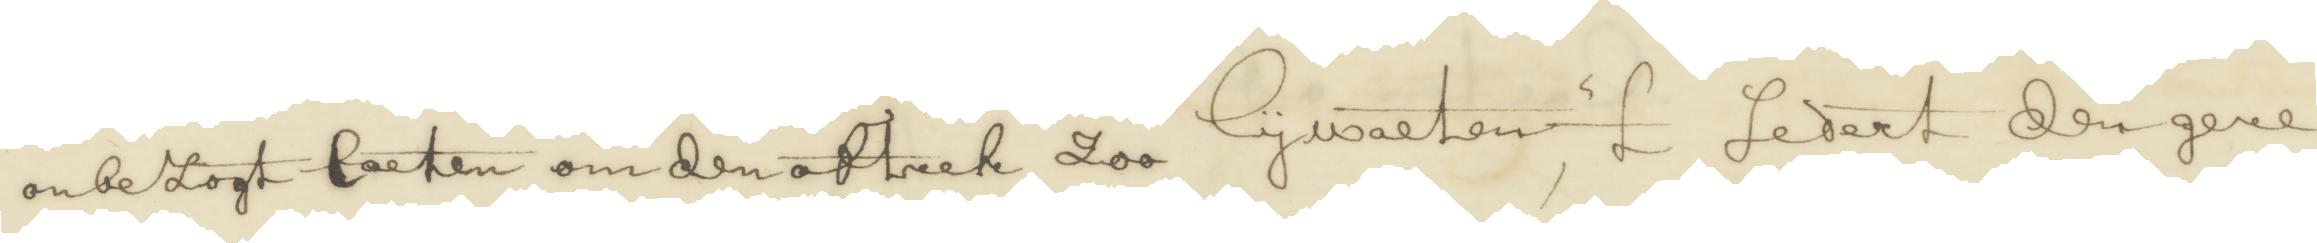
onbezogt laeten om den aftrek Zoo lijwaeten ’t sedert den gere
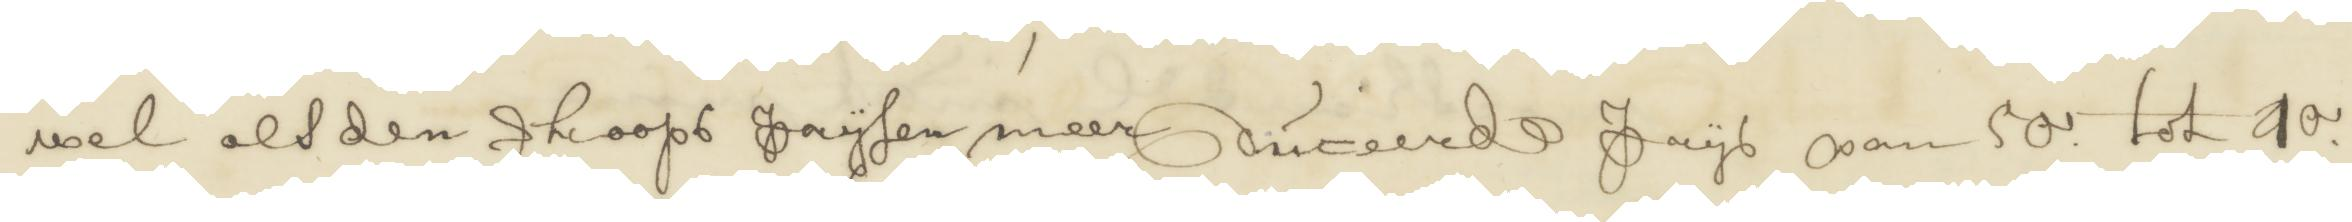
wel als den verkoops prijsen meer duceerde prijs van 50. tot 40.
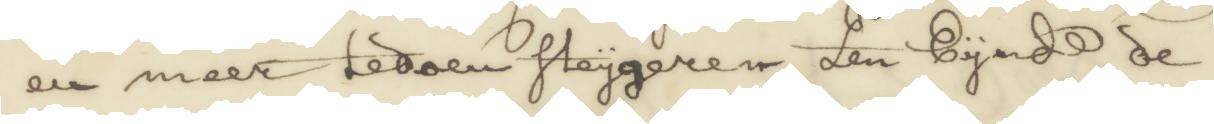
en meer te doen steijgeren ten Eijnde de
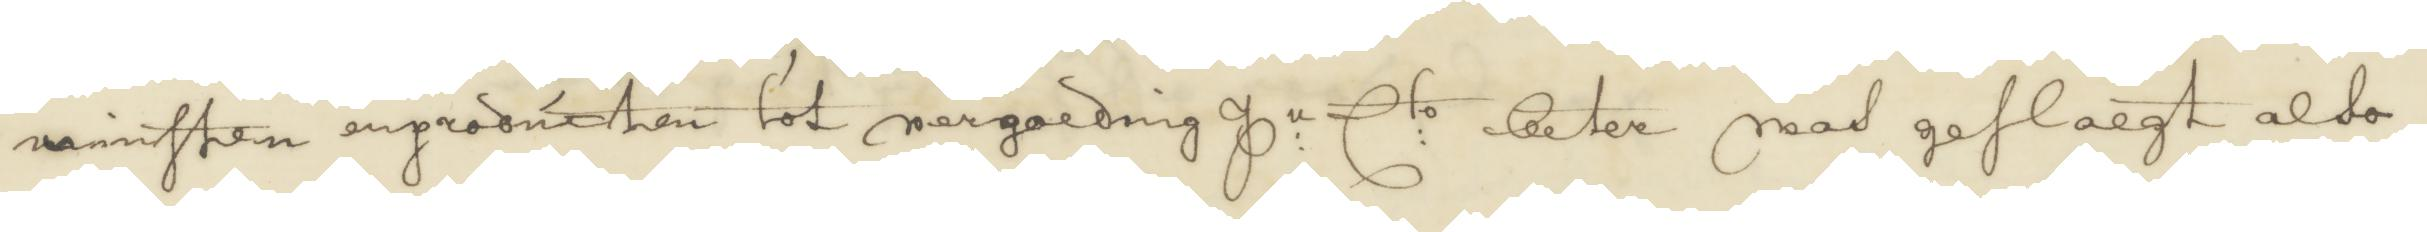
winsten en producten tot vergoeding p:r C:to beter was geslaegt also
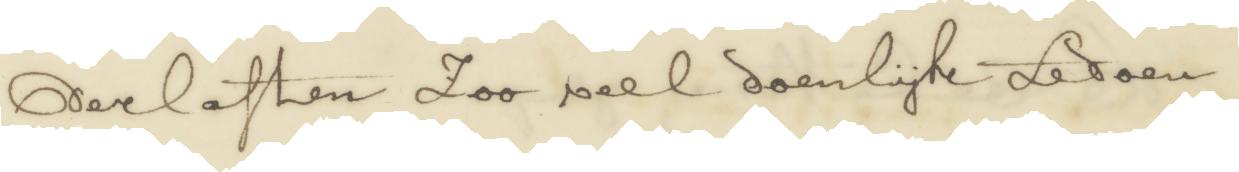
der lasten Zoo veel doenlijk te doen
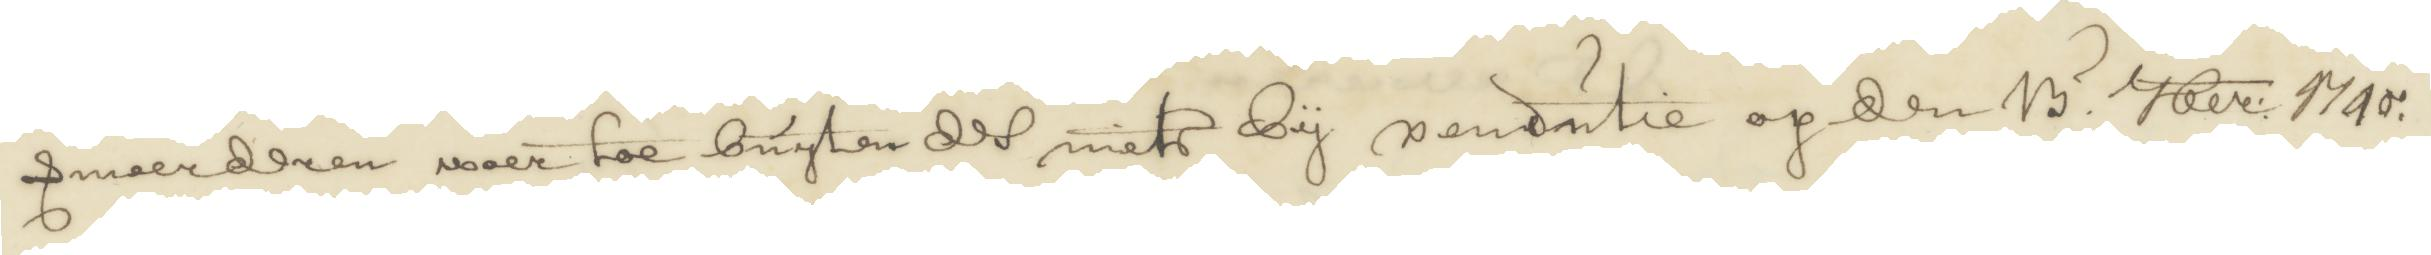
vermeerderen waer toe buijten des niets bij vendutie op den 13.' 7ber: 1740:
